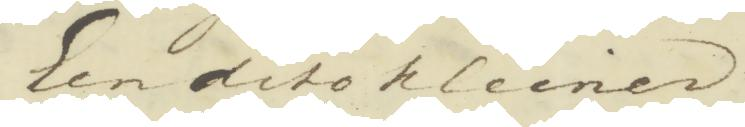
Een dito kleener
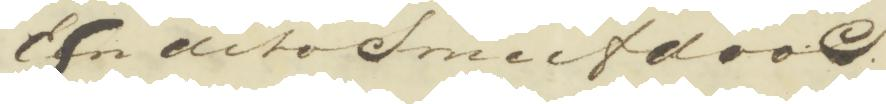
Een dito snuifdoos.
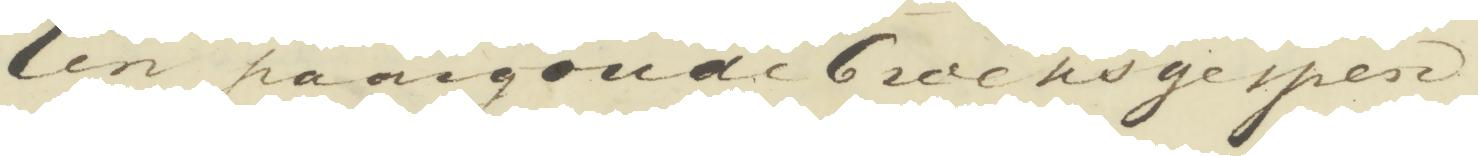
Een paargoude broeksgespen
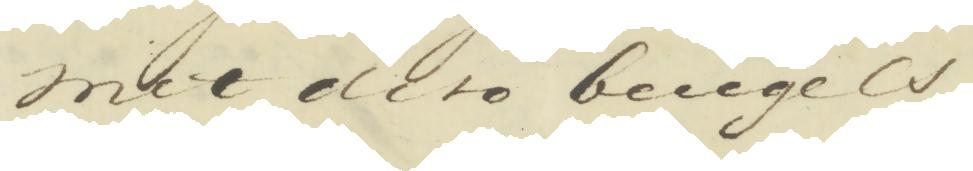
met dito beugels
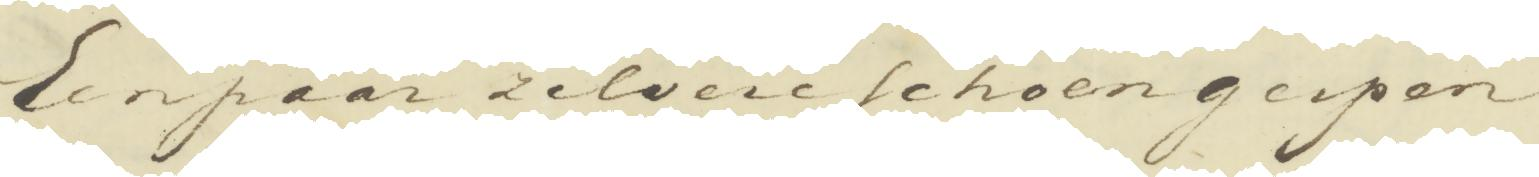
Een paar zilvere schoengespen
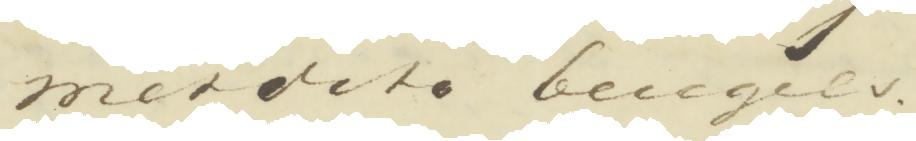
met dito beugels.
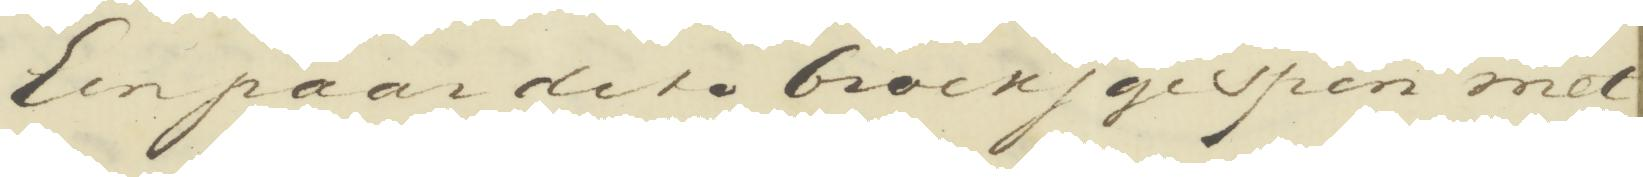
Een paar dito broeksgespen met
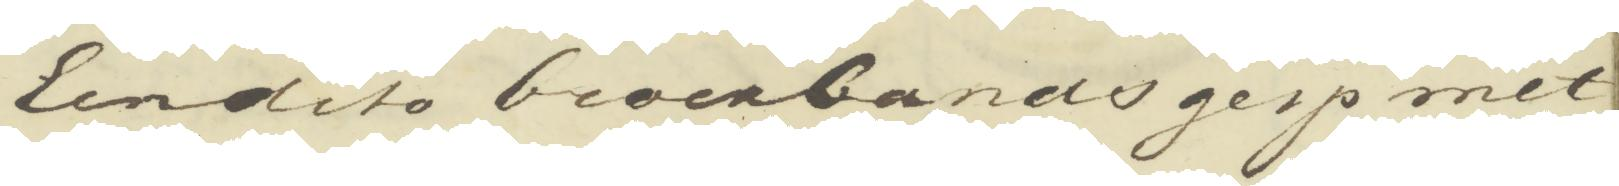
Een dito broekbandsgesp met
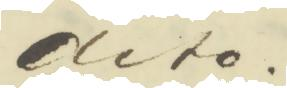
dito.
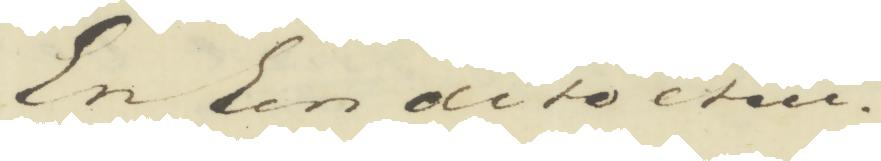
En Een dito etui.
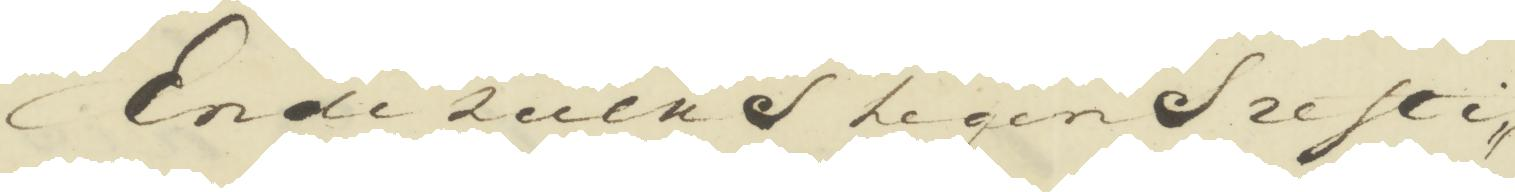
Ende zulks tegens resti
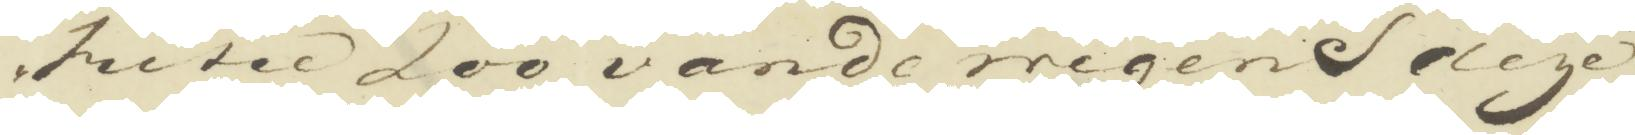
„tutie zoo van de wegens deze
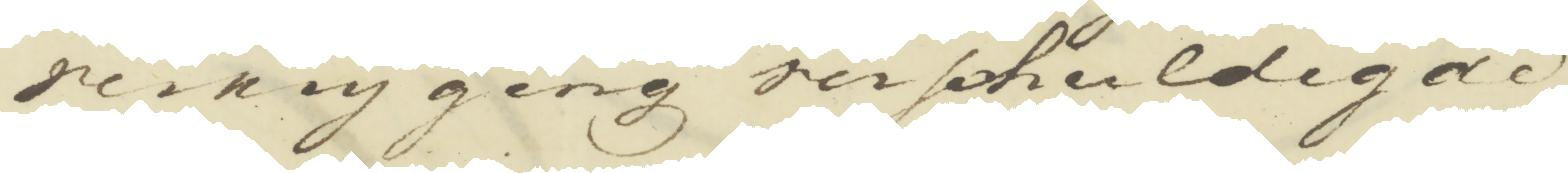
verkryging verschuldigde
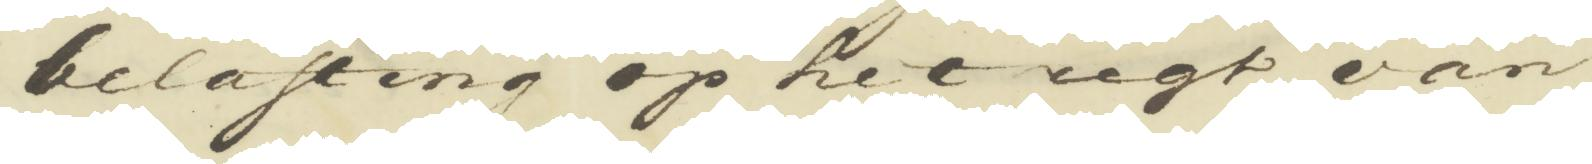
belasting op het regt van
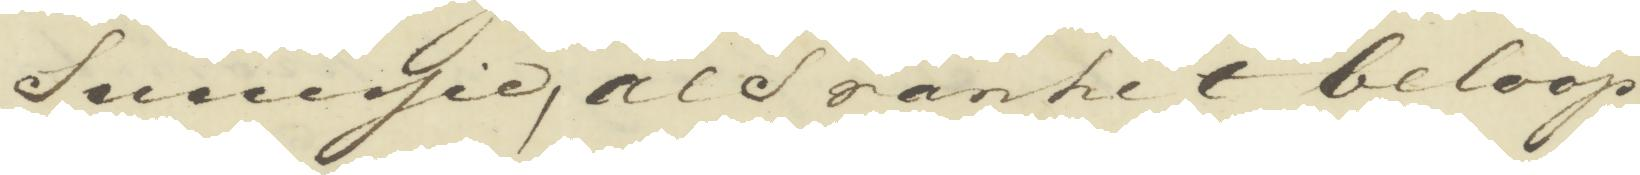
successie, als van het beloop
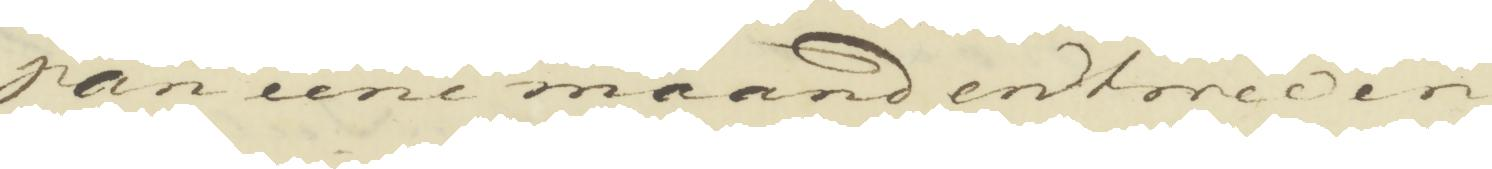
van eene maand en twee en
